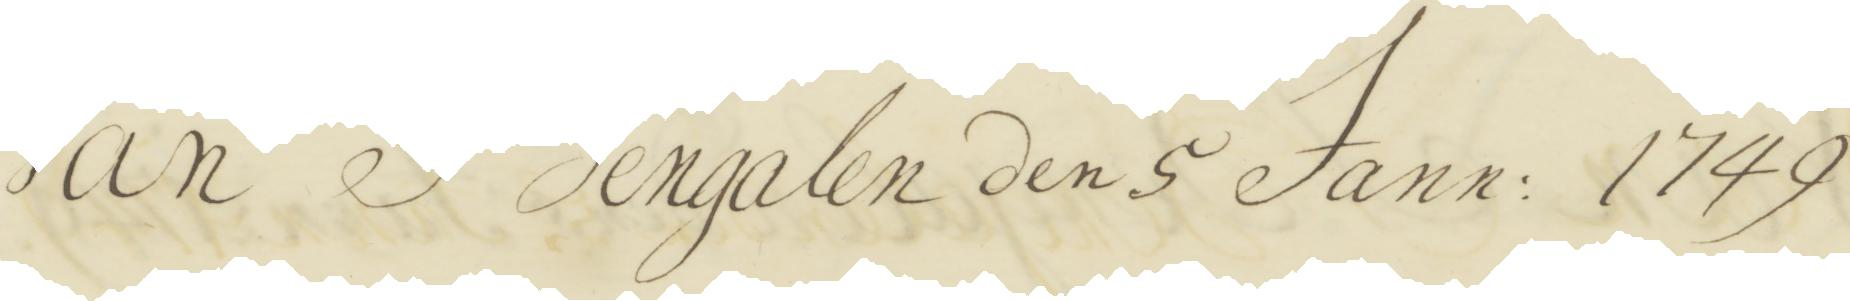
Van Bengalen den 5 Iann: 1749
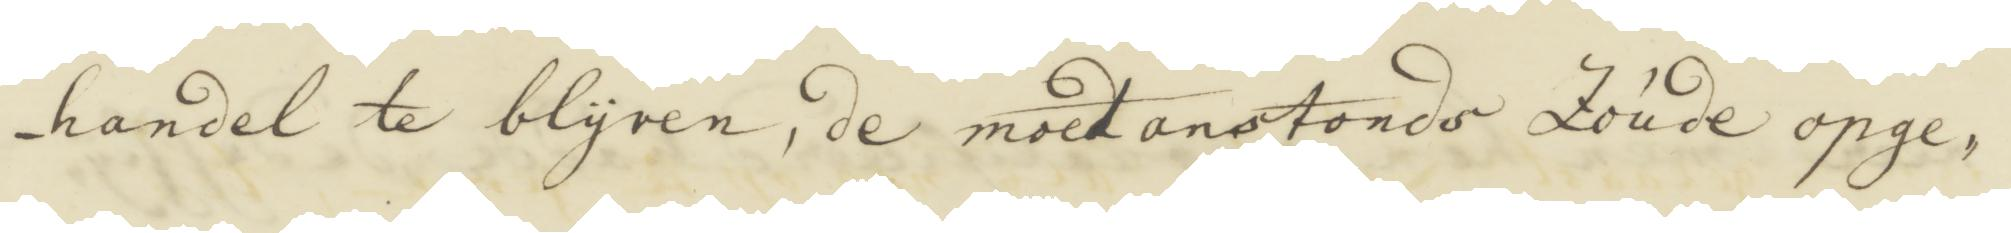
_handel te blijven, de moet anstonds zoude opge„
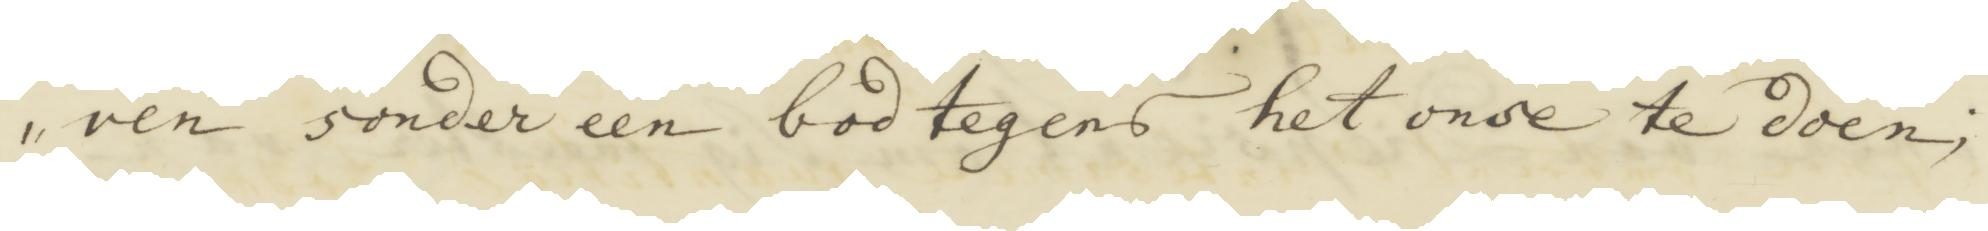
„ven sonder een bod tegens het onse te doen,
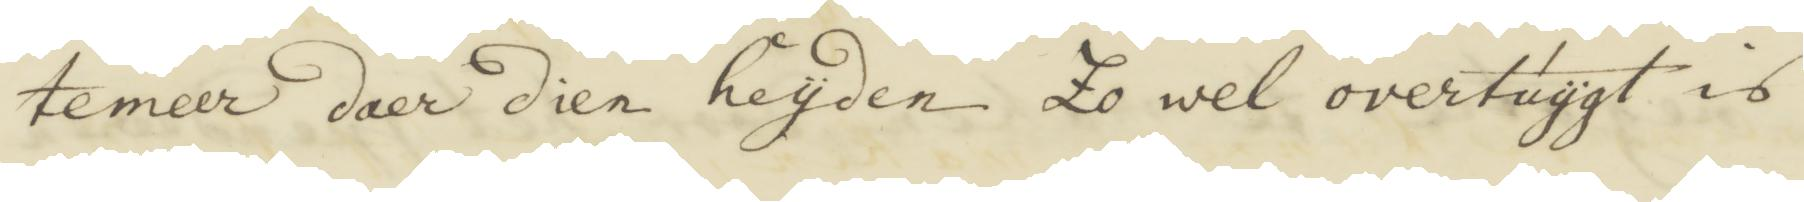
temeer daer dien heijden zo wel overtuijgt is
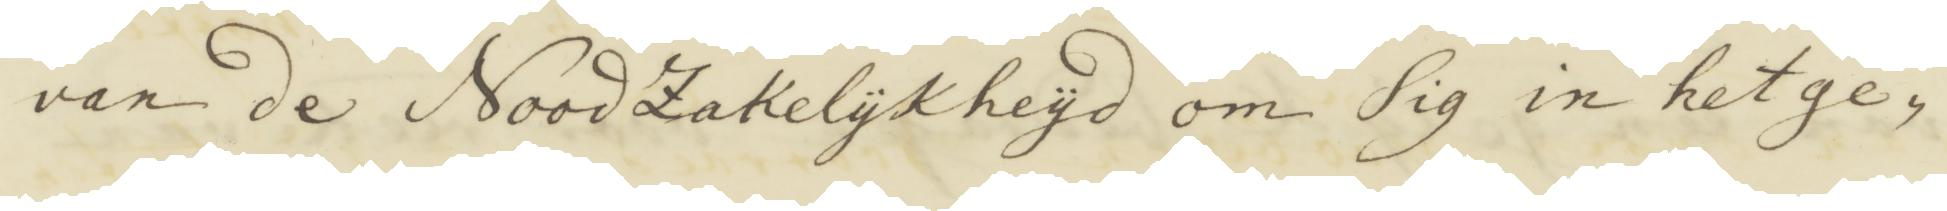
van de Noodzakelijkheijd om sig in het ge„
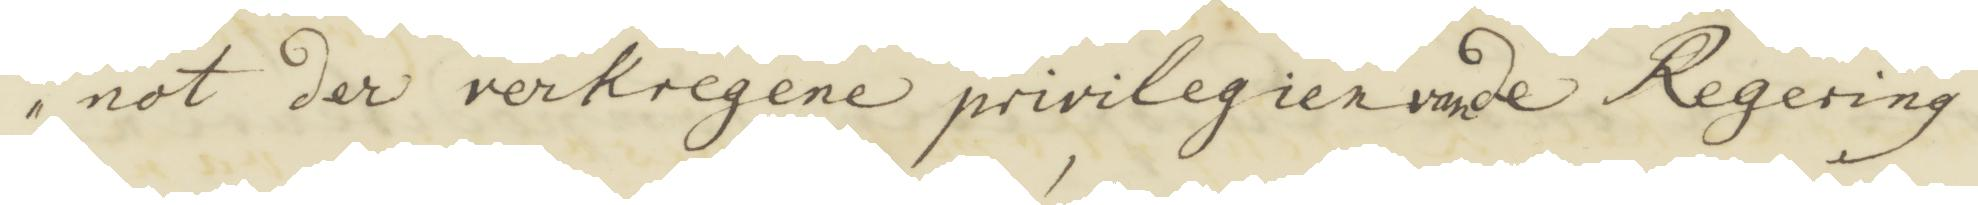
„not der verkregene privilegien van de Regering
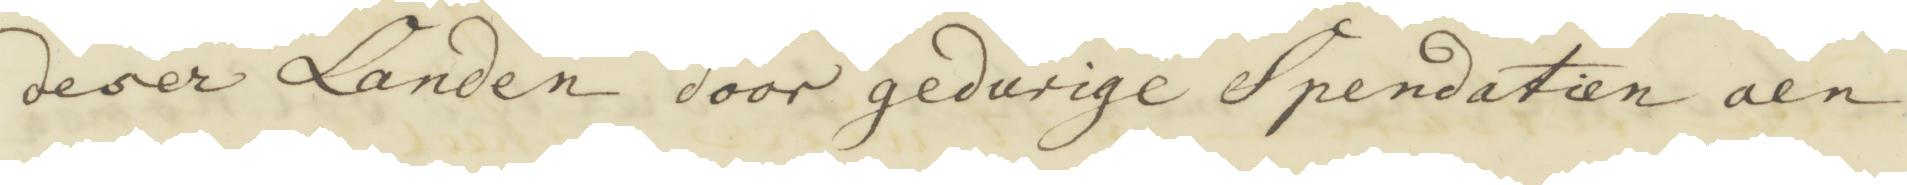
deser Landen door gedurige Spendatien aen
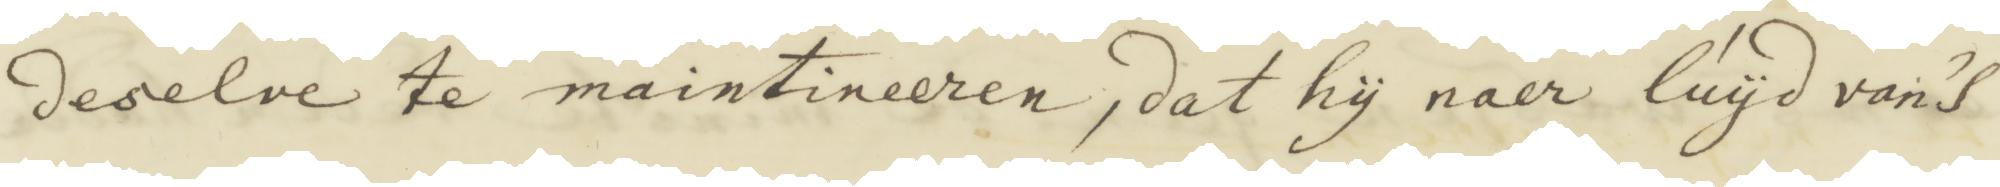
deselve te maintineeren, dat hij naer luijd van 's
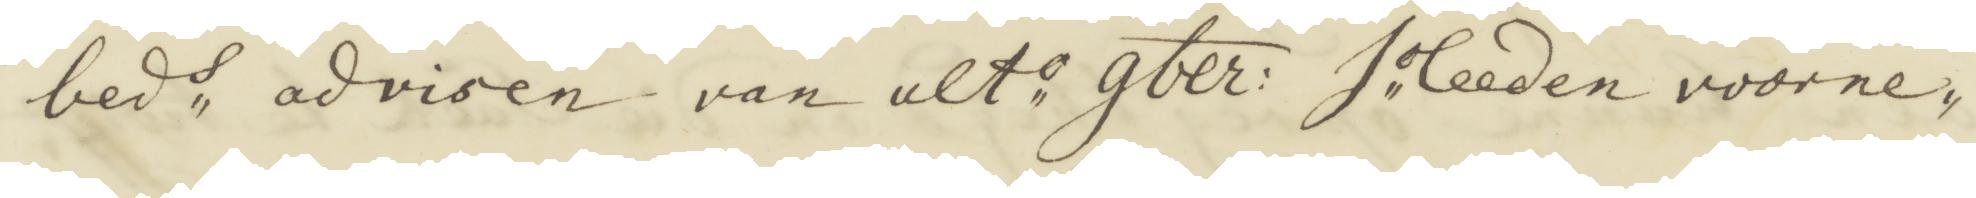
bed„s advisen van ult„o 9ber: J„oleeden voorne„
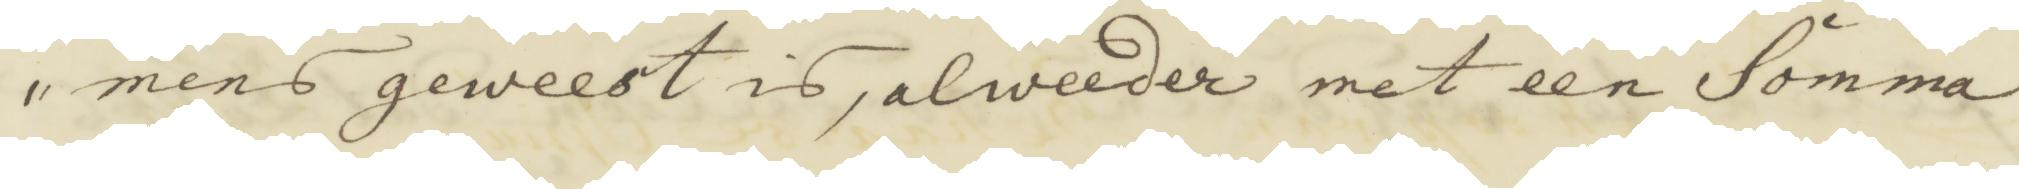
„mens geweest is, alweeder met een Somma
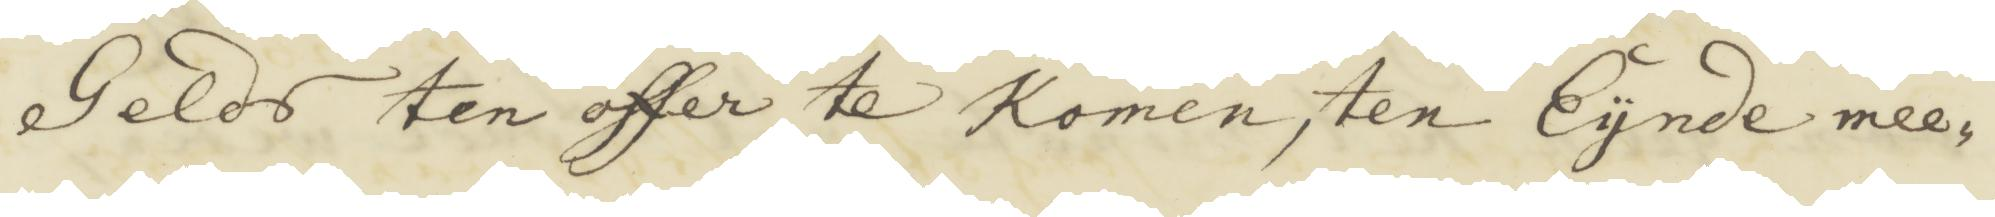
Gelds ten offer te komen, ten Eijnde mee„
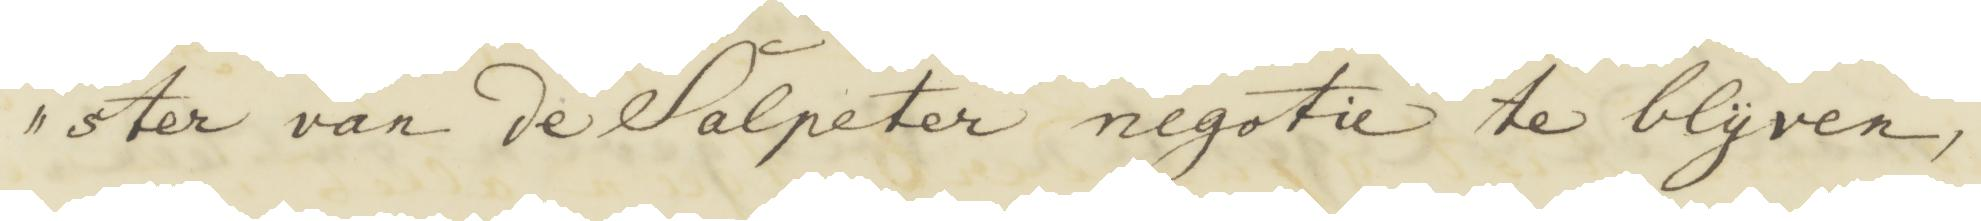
„ster van de Salpeter negotie te blijven,
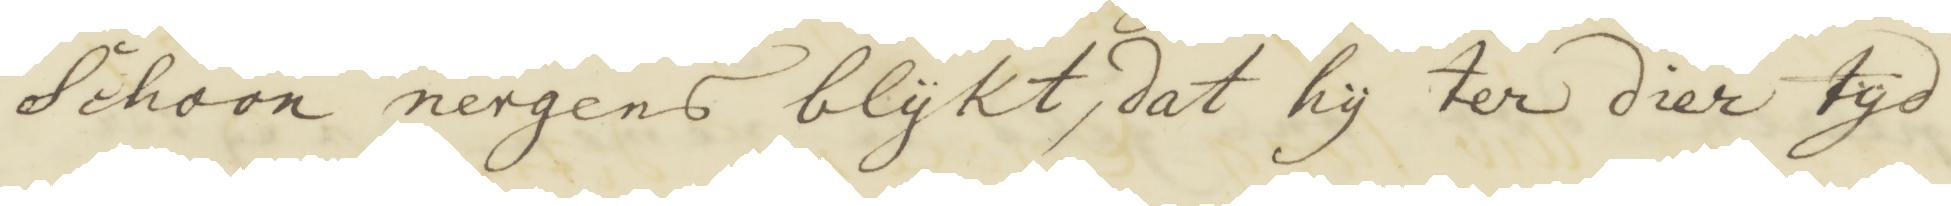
Schoon nergens blijkt, dat hij ter dier tijd
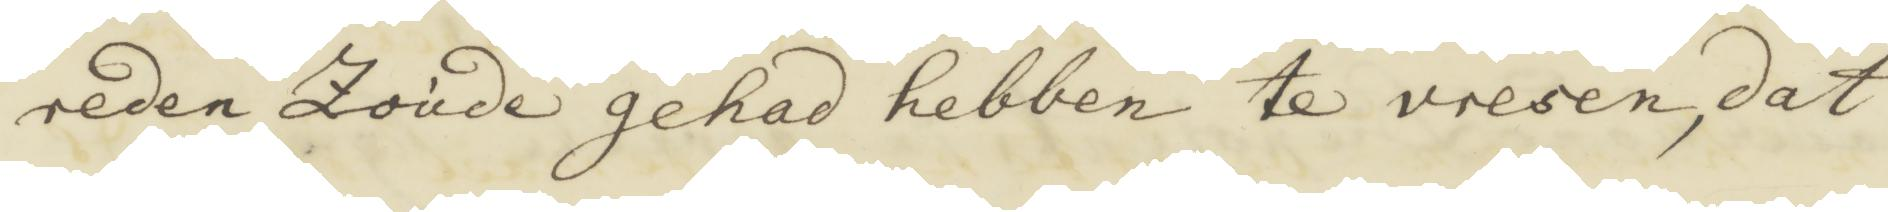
reden zoude gehad hebben te vresen, dat
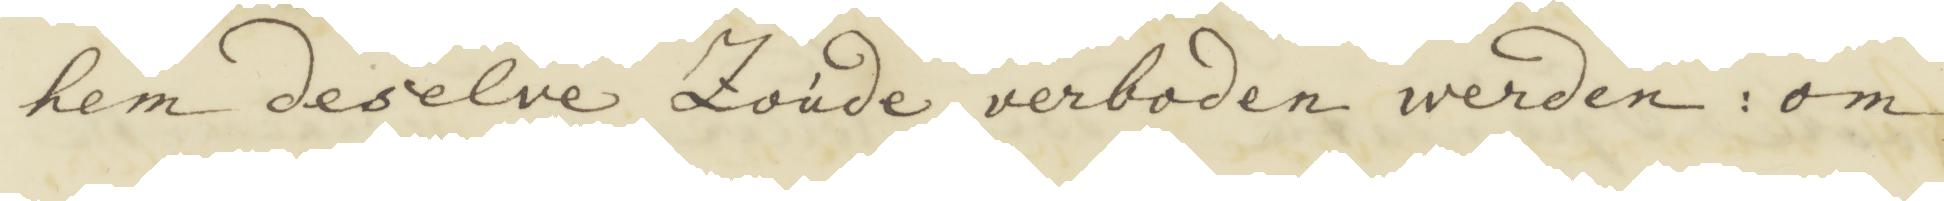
hem deselve zoude verboden werden: om
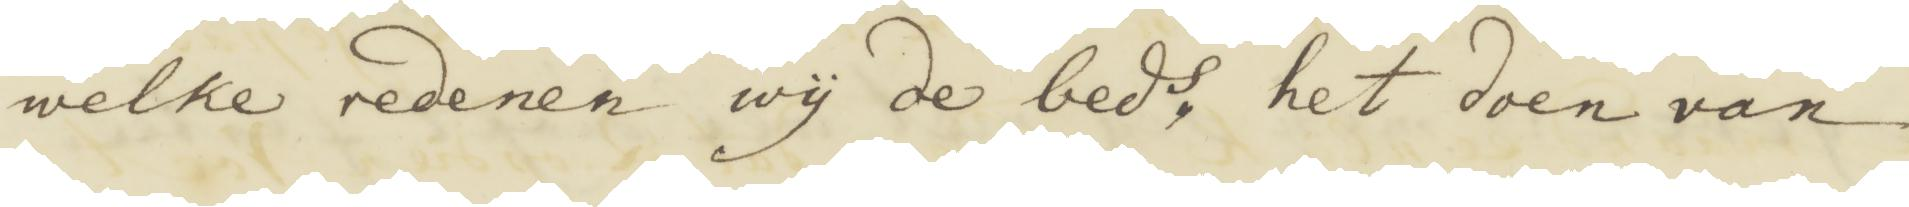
welke redenen wij de bed„s het doen van
